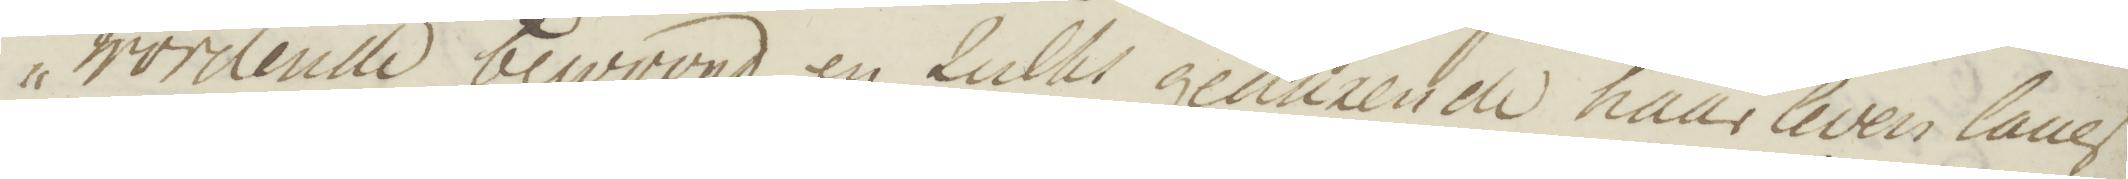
„wordende bewoond en Zulks gedurende haar leven lang
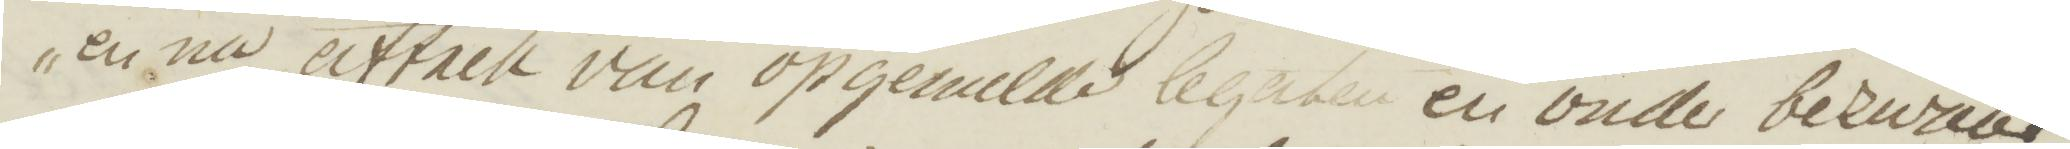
„en na aftrek van opgemelde legaten en onder bezwaar
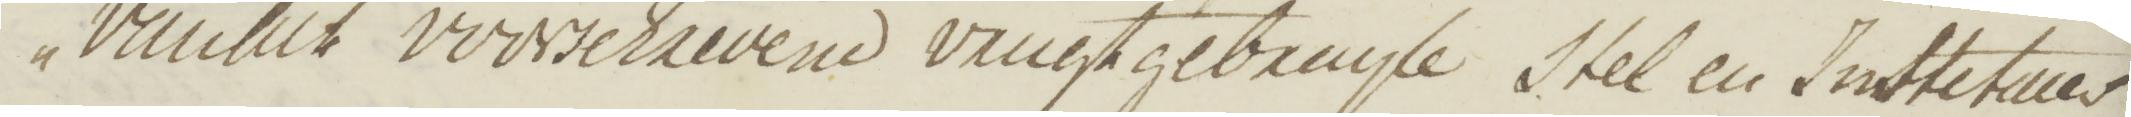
„van dit voorschrevene vrugtgebruyk stel en Instesteer
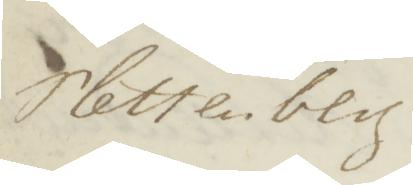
Plettenberg
